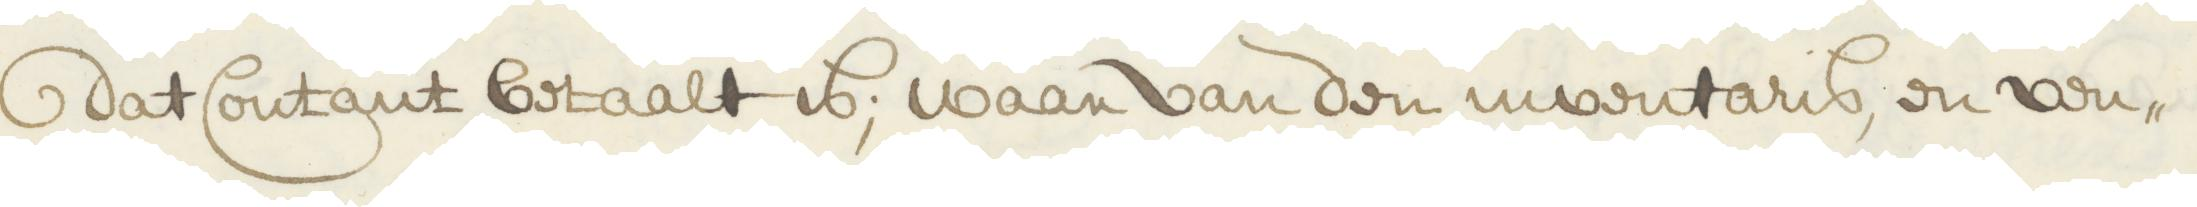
dat Contant betaalt is; waar van den inventaris, en ven„
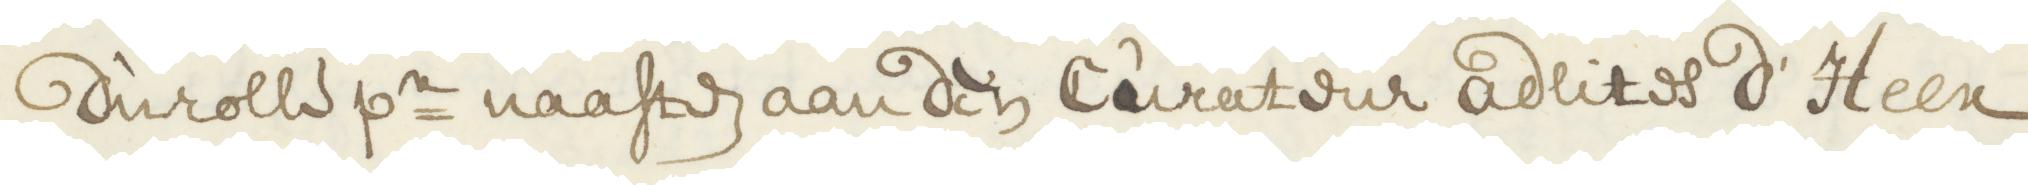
durolle p=r naasten aan den Curateur adlites d’ Heer
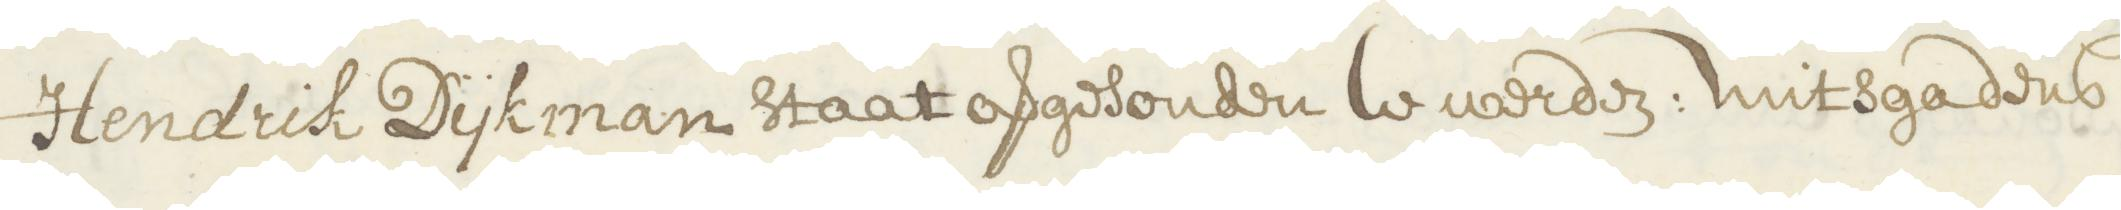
Hendrik Dijkman staat overgesonden te werden: mitsgaders
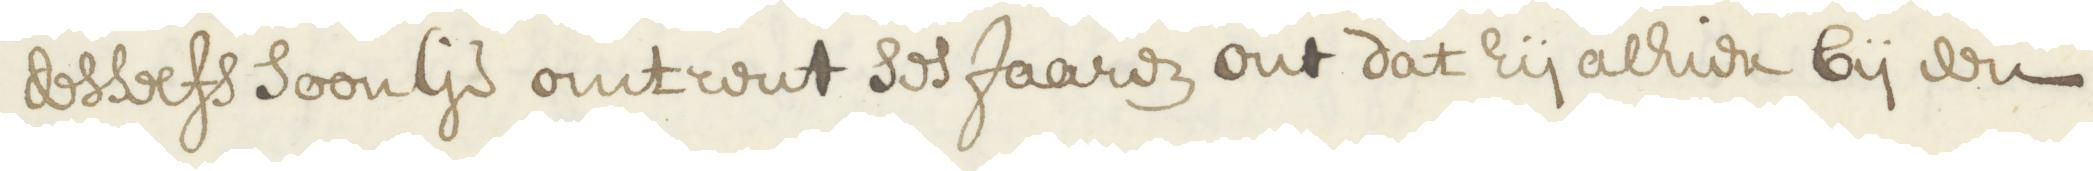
desselfs soontje omtrent ses Jaaren out dat hij alhier bij een
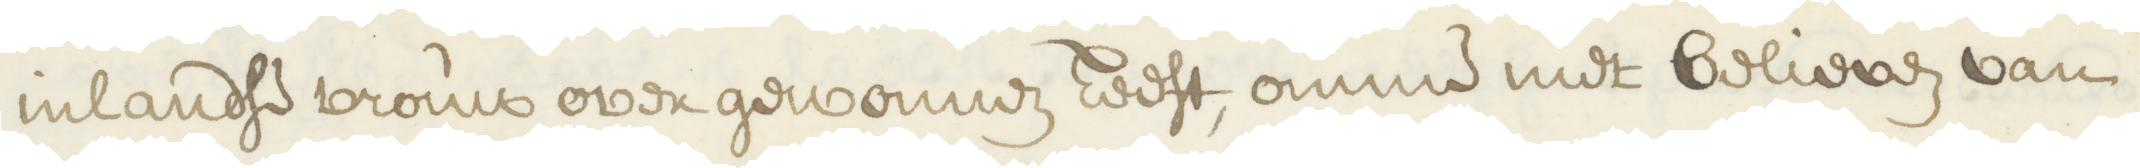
inlandse vrouw over gewonnen heeft, omme niet believen van
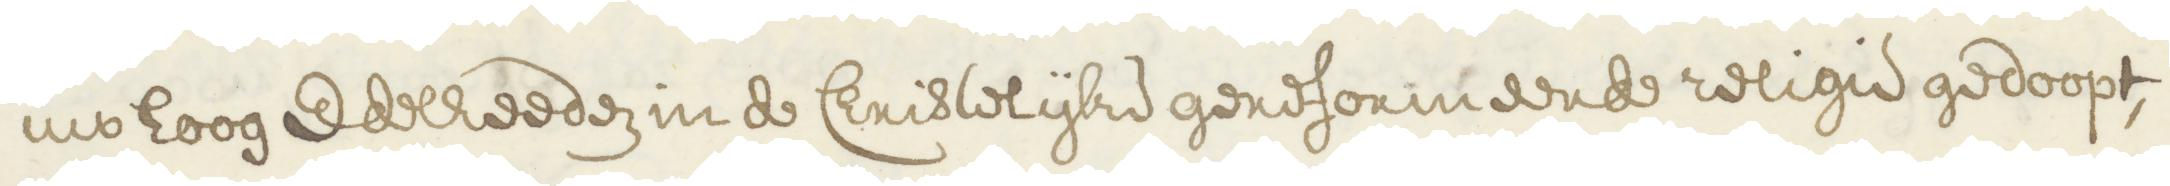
uw hoog Edelheeden in de Christelijke gereformeerde religie gedoopt,
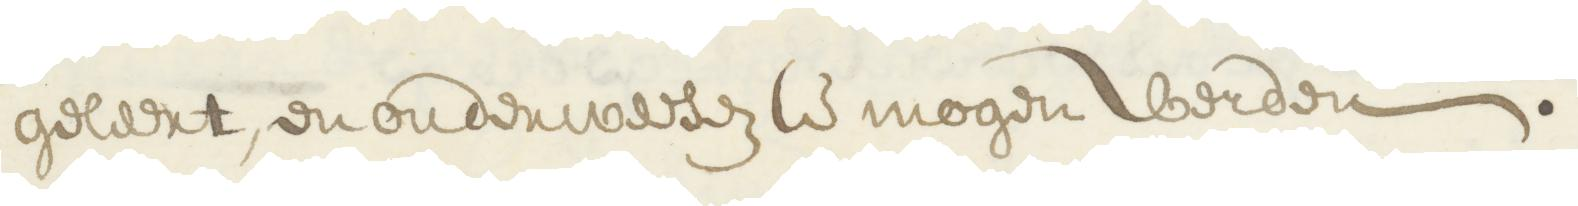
geleert, en onderweesen te mogen werden.
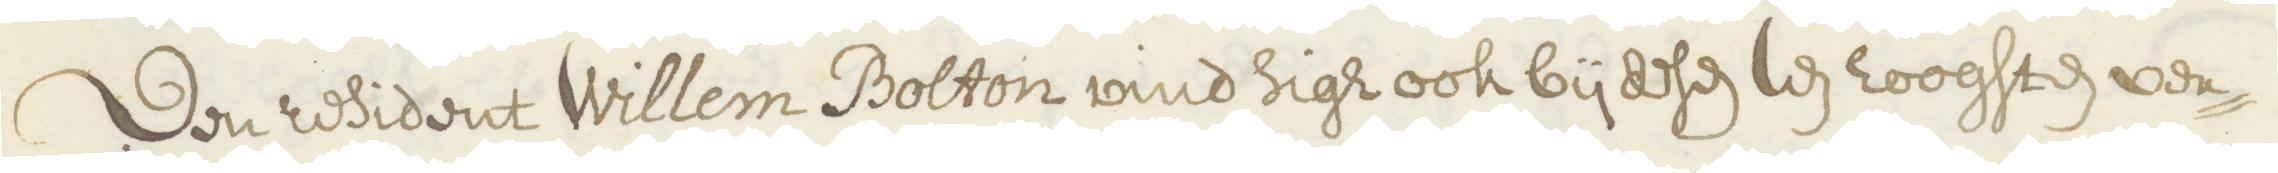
Den resident Willem Bolton vind sigh ook bij desen ten hoogsten ver„
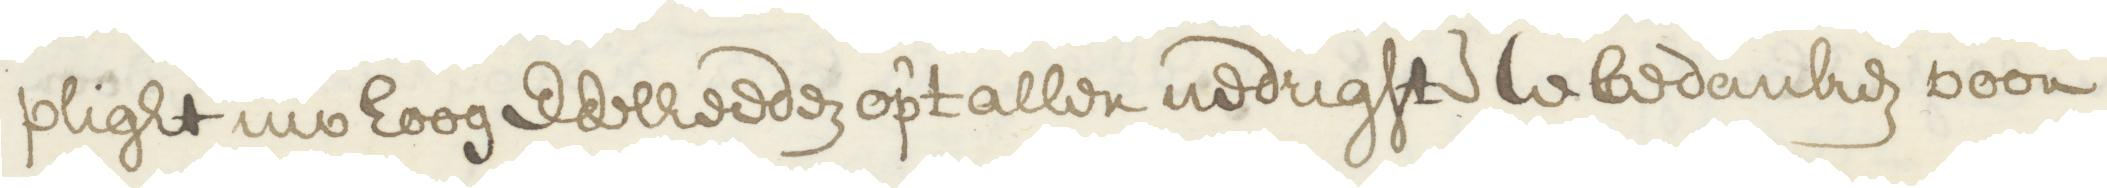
plight uw hoog Edelheeden op ’t aller nedrigste te bedanken voor
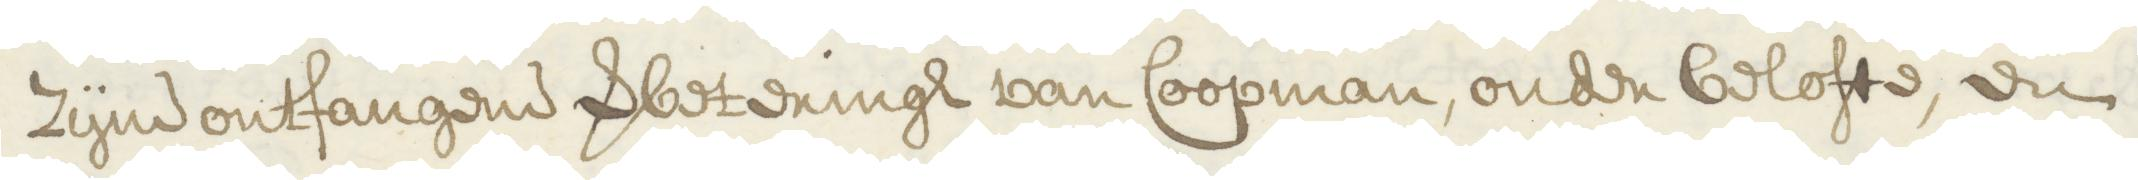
zijne ontfangene verbeteringh van Coopman, onder belofte, en
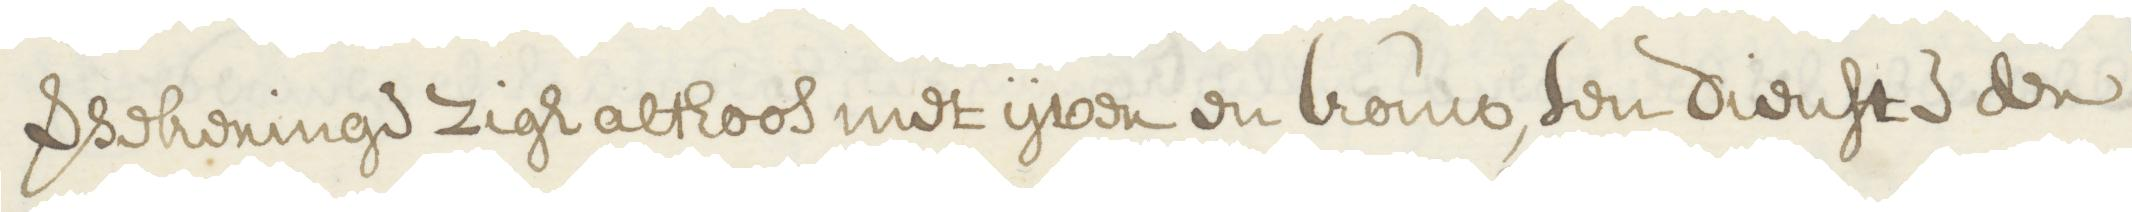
versekeringe zigh althoos met ijver en trouw, ten dienste der
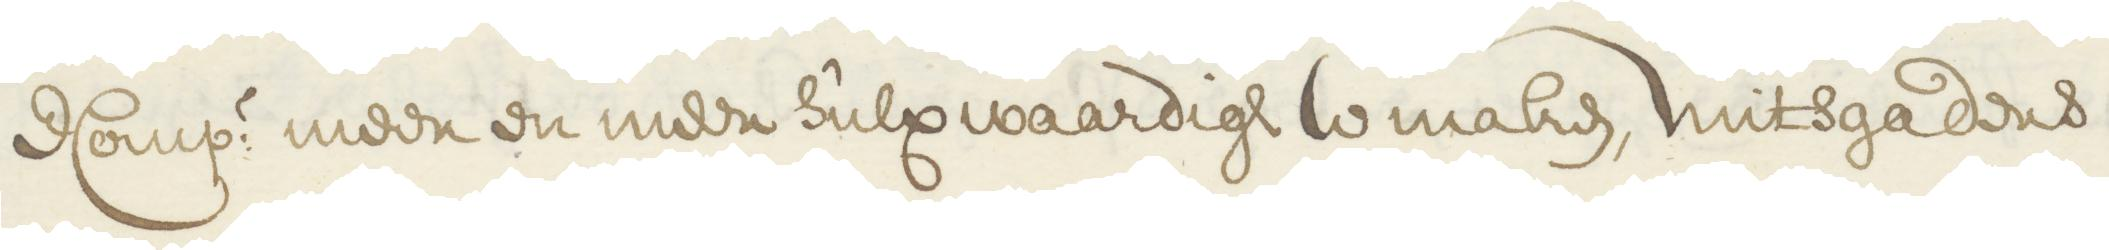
EComp:s meer en meer sulx waardigh te maken, mitsgaders
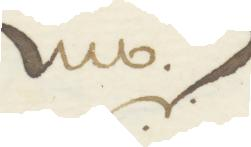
uw.
